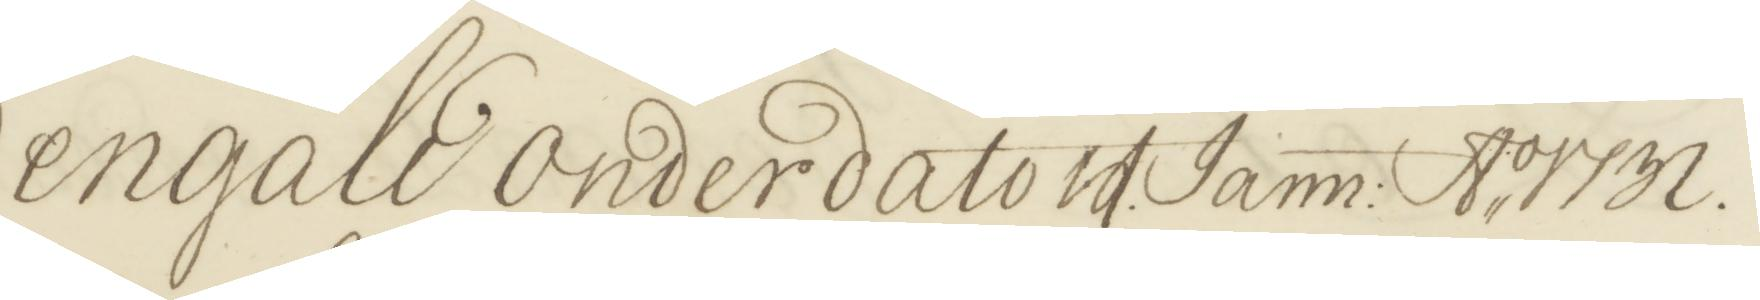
Van Bengale onder dato 14 Jann: A„o 1732.
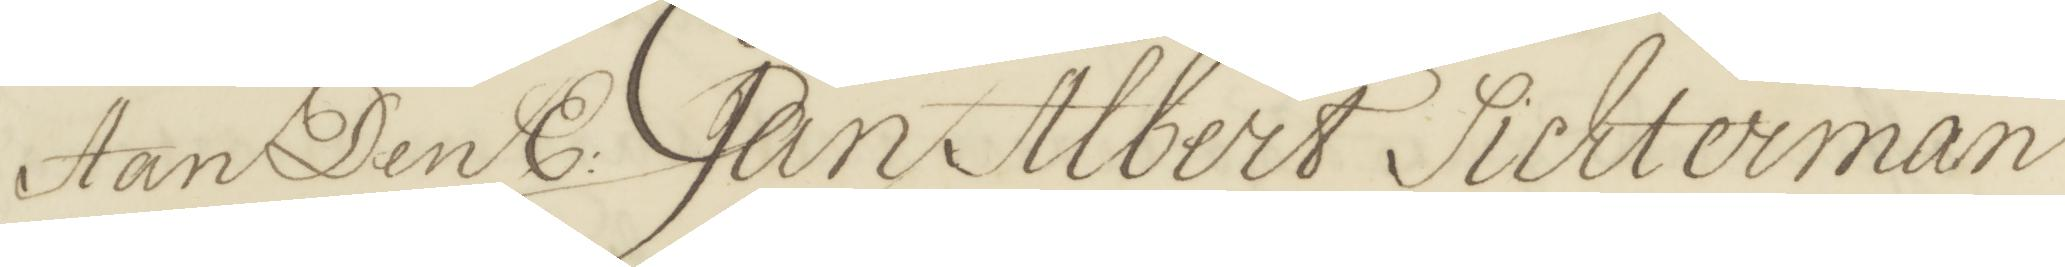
Aan Den E: Jan Albert Sichterman
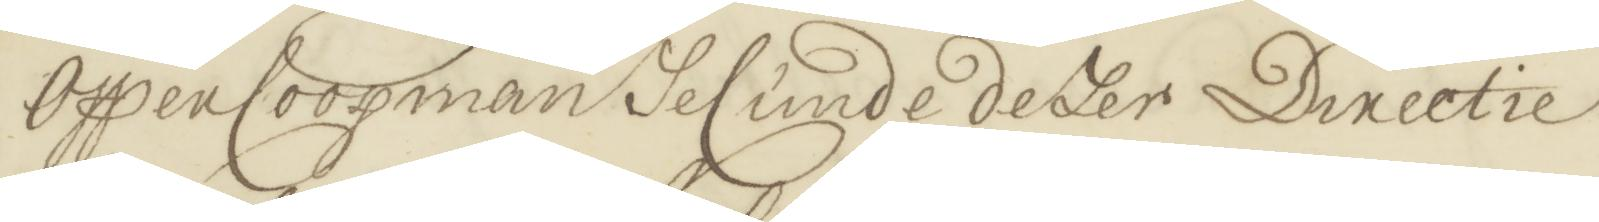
Opper Coopman Secunde dezer Directie
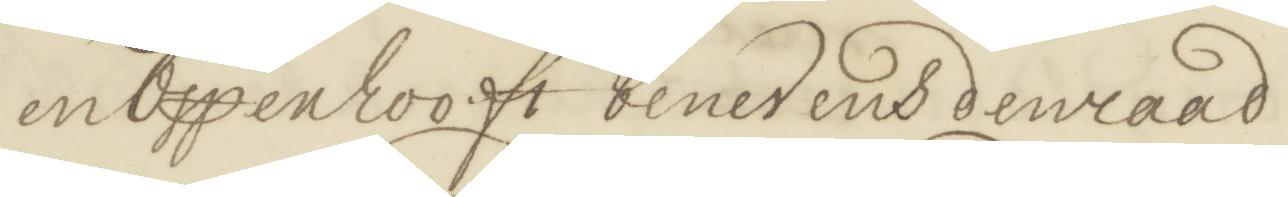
en Opperhooft benevens den raad
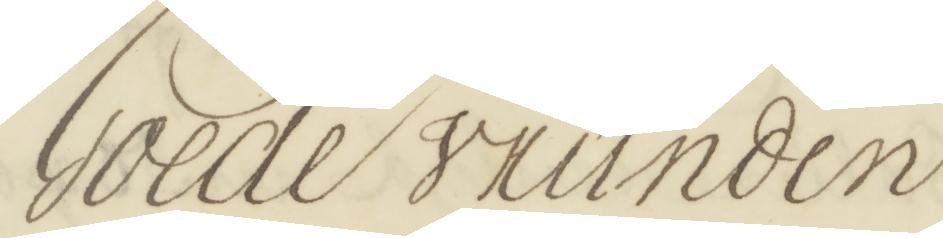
Goede vrunden
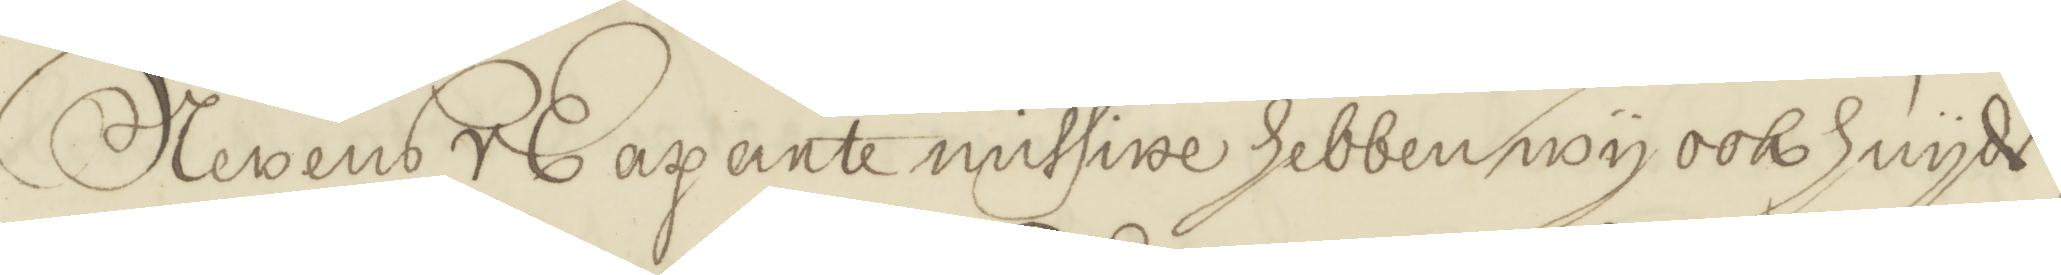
Nevens vE aparte missive hebben wij ook huijden
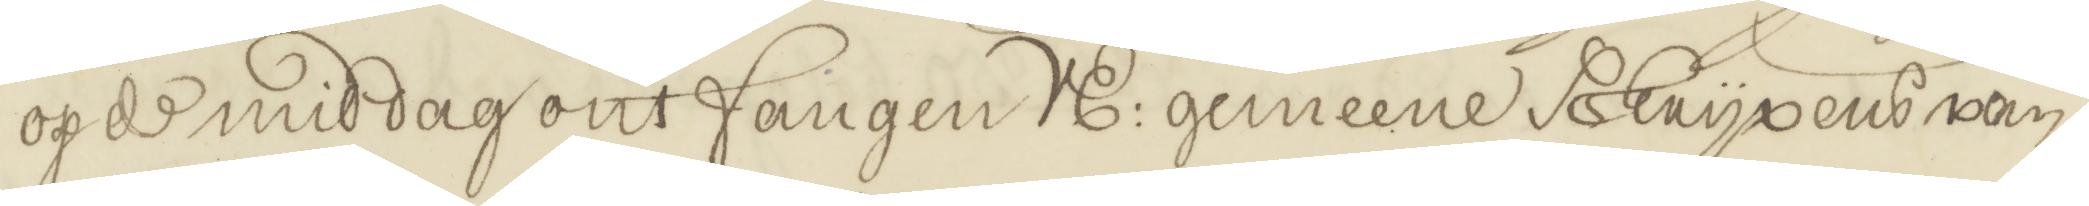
op de middag ontfangen VE: gemeene Schrijvens van
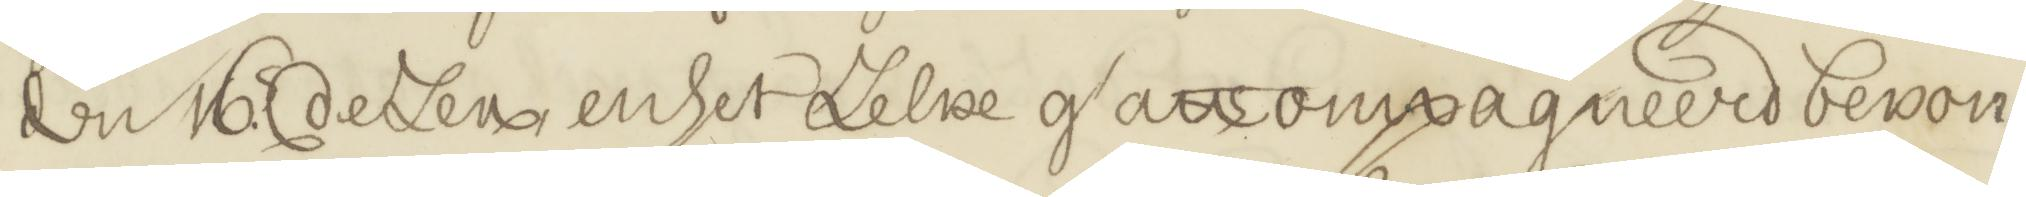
den 16: dezer, en het Zelve g’accompaqneerd bevon
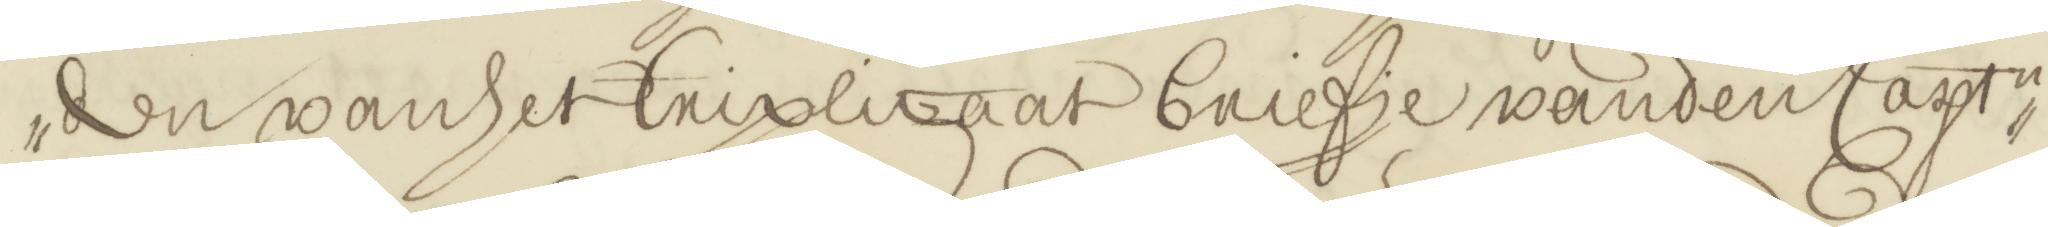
„den van het triplicaat briefje van den Capt„n
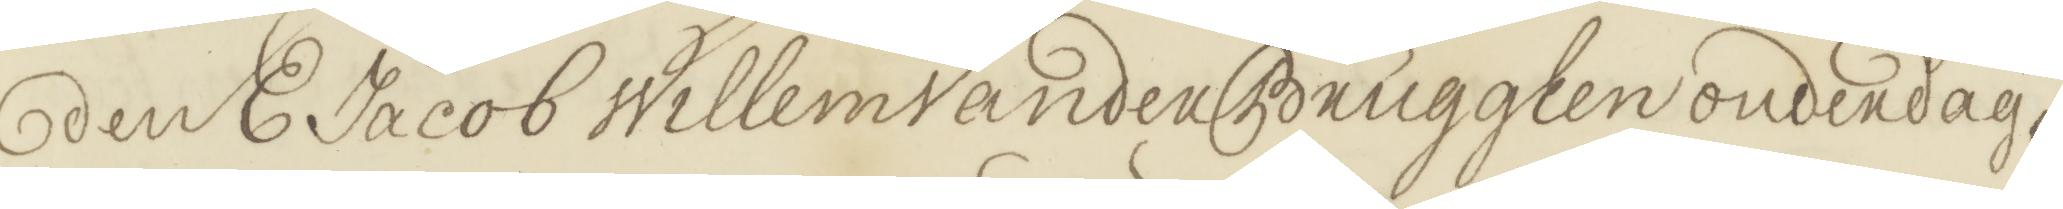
den E Jacob Willem vander Brugghen onderdag„
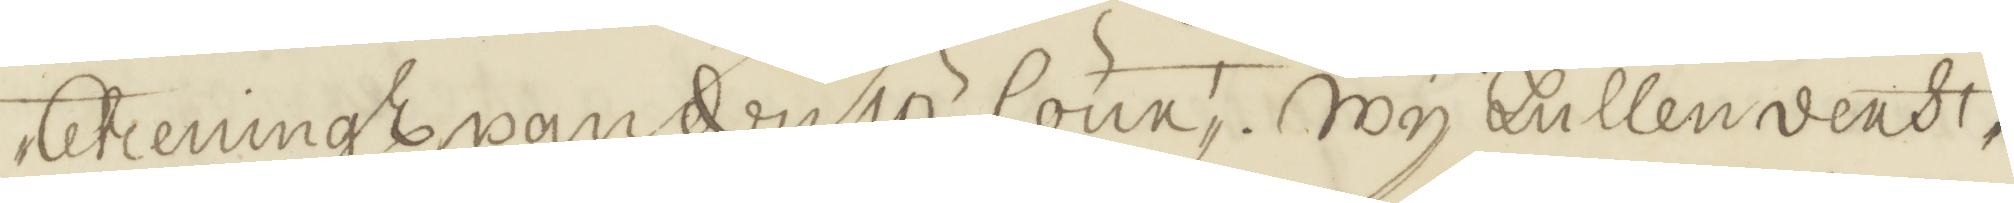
„tekeningh van den 10.' Cour„t wij Zullen eerst„
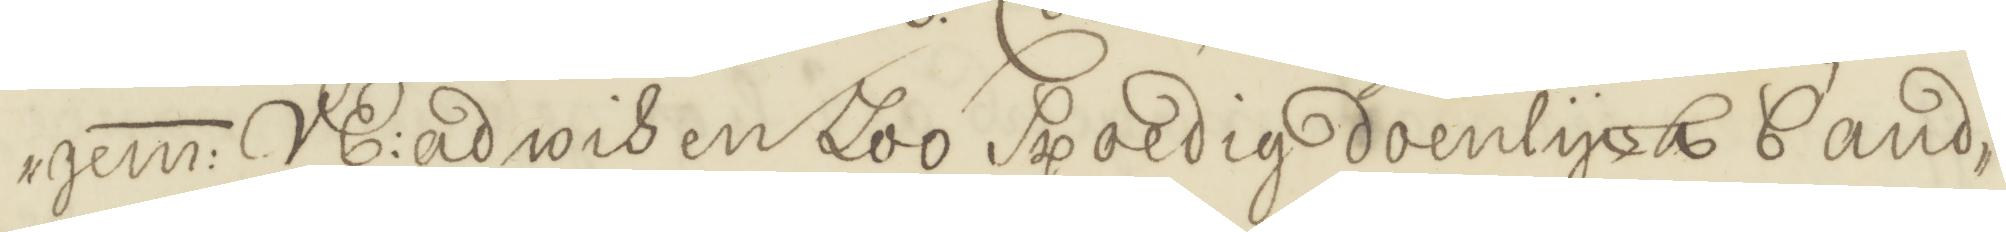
„gem: VE: advis en Zoo spoedig doenlijck b'and„
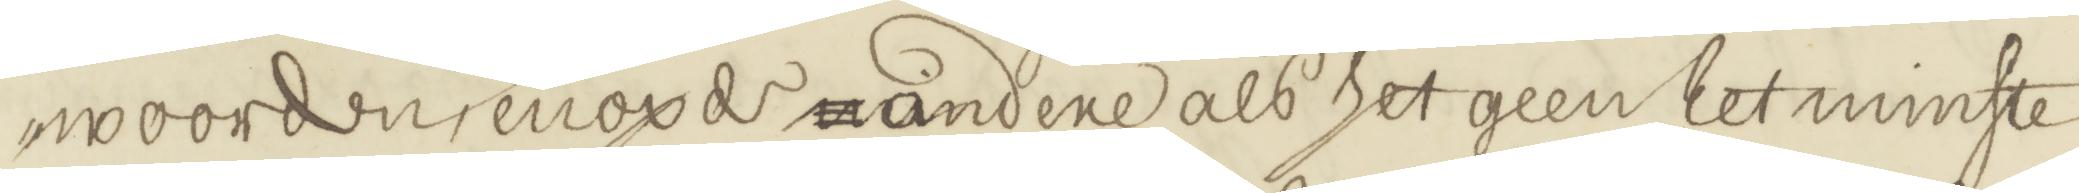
„woorden, en op de u andere als het geen het minste
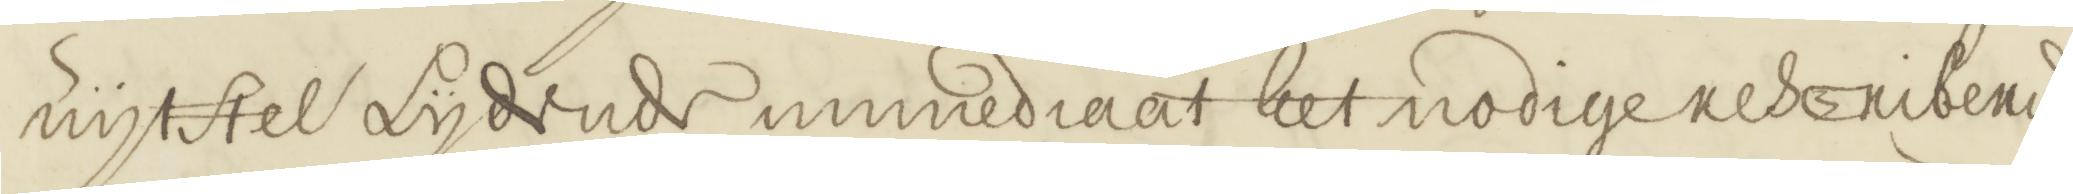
uijtstel Lijdende immediaat het nodige rescriberen
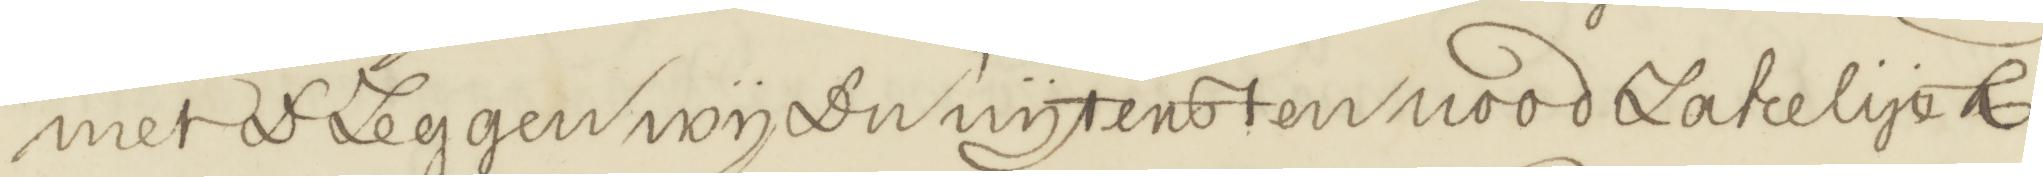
met te Zeggen wij ten uijtersten nood Zakelijck
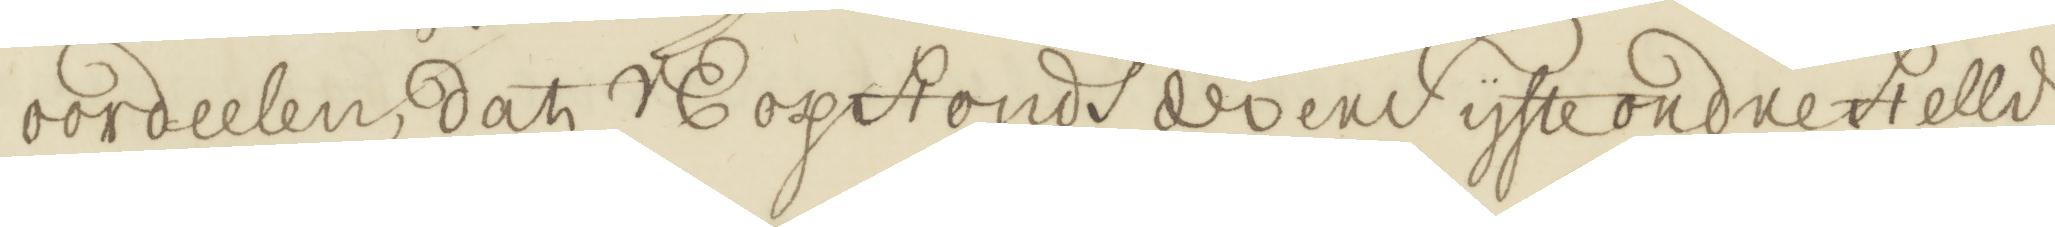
oordeelen, dat VE opstonds de vereijste ordre Stelle
